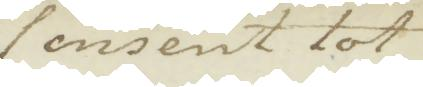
Consent tot
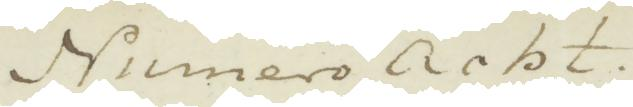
Numero Acht.
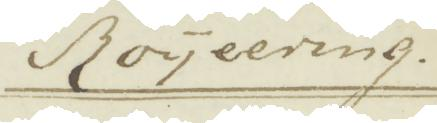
Roijeering.
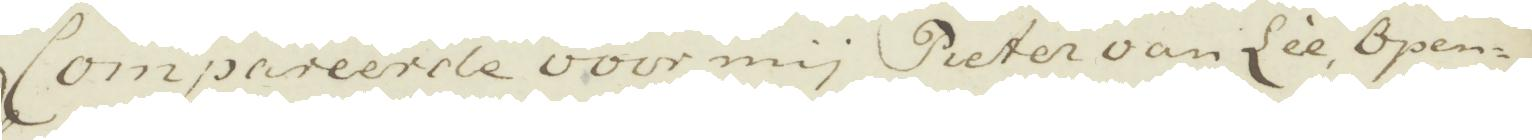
Compareerde voor mij Pieter van Leè, Open=
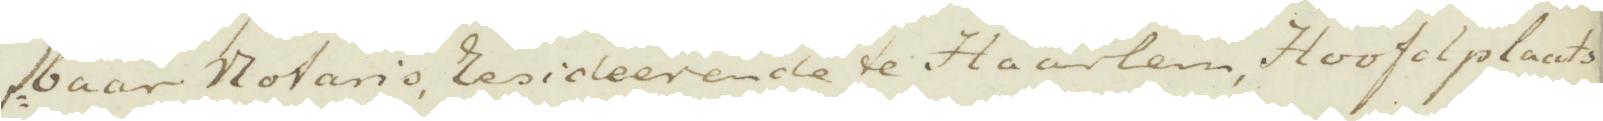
=baar Notaris, resideerende te Haarlem, Hoofdplaats
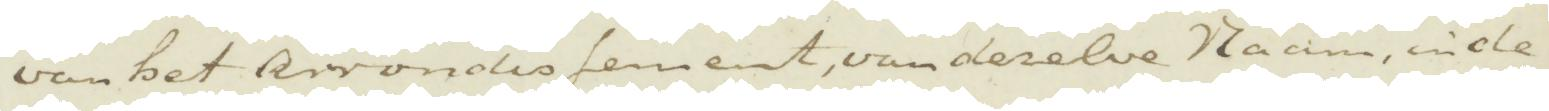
van het Arrondissement, van dezelve Naam, in de
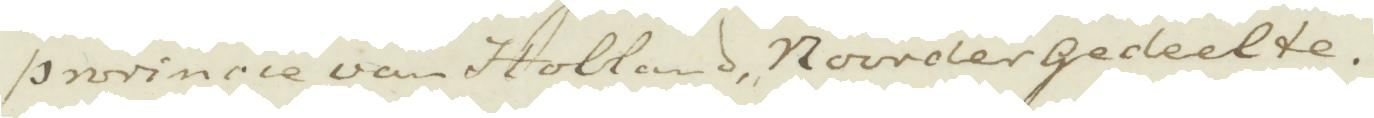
provincie van Holland, Noorder gedeelte.
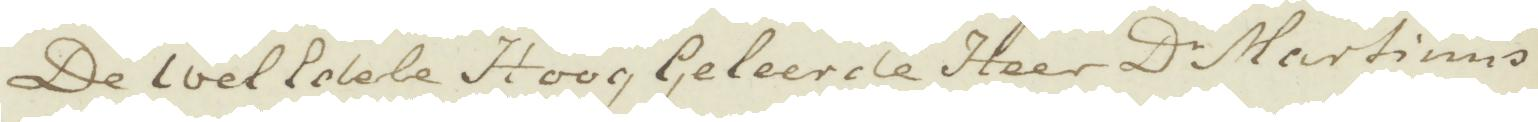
De Wel Edele Hoog Geleerde Heer Dr Martinus
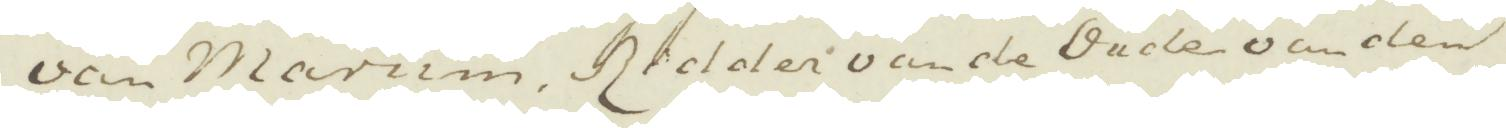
van Marum, Ridder van de Orde van den
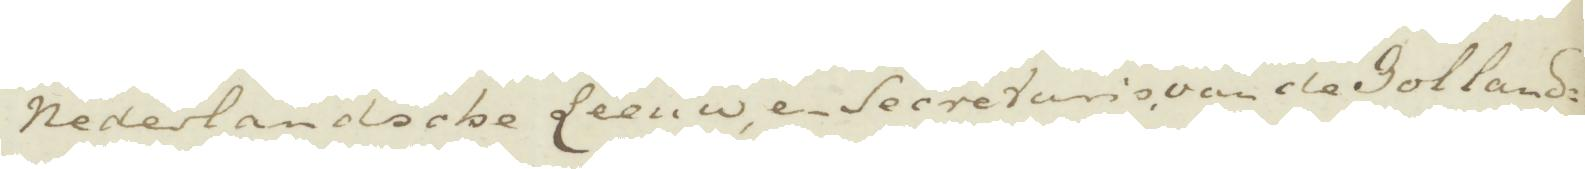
Nederlandsche Leeuw, en Secretaris van de Holland=
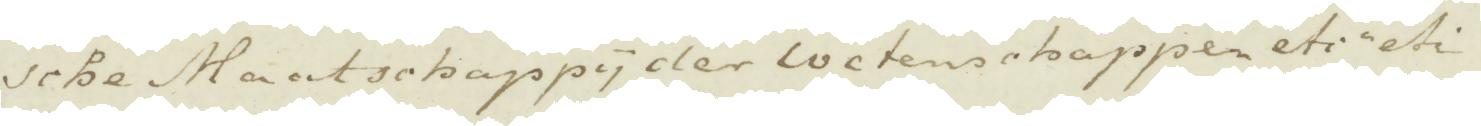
sche Maatschappij der waterschappen etc ect
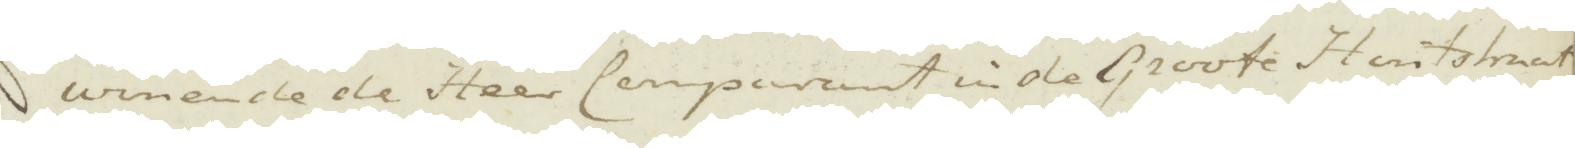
wonende de Heer Comparant in de Groote Houtstraat
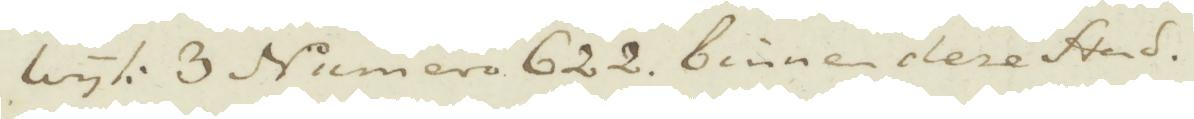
wijk 3 Numero 622. binnen deze stad.
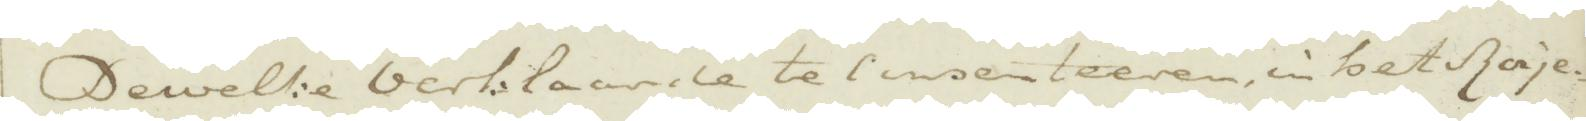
Dewelke verklaarde te consenteeren, in het Roije
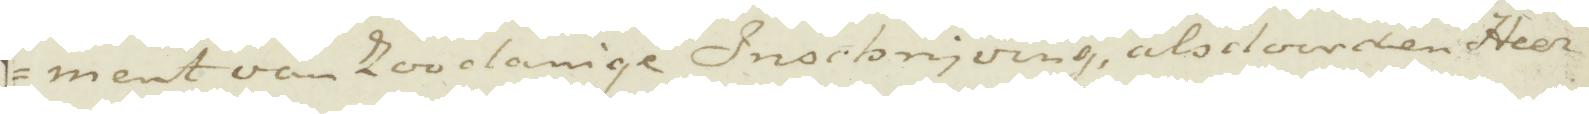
=ment van zoodanige Jnschrijving, als door den Heer
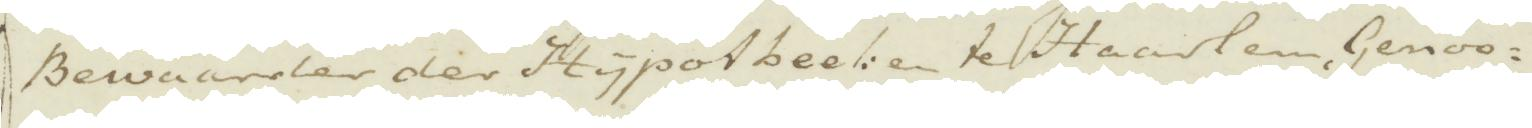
Bewaarder der Hijpotheeken te Haarlem, Genoo=
